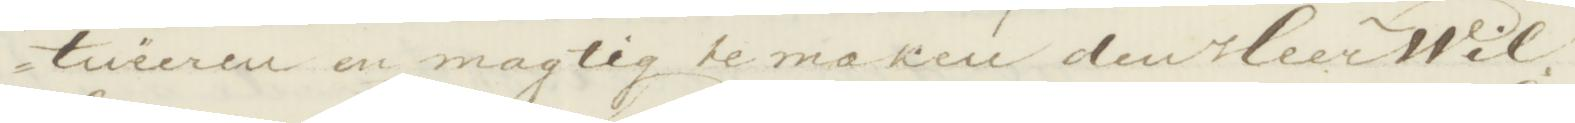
=tuëeren en magtig te maken den Heer Wil,
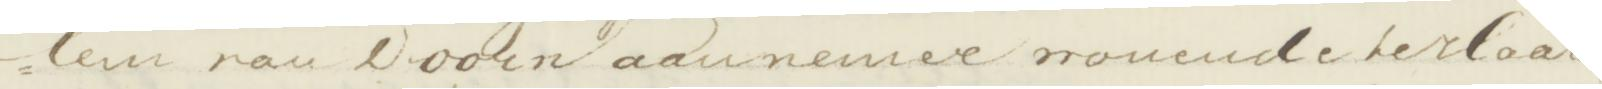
=lem van Doorn aannemer wonende te Haar.
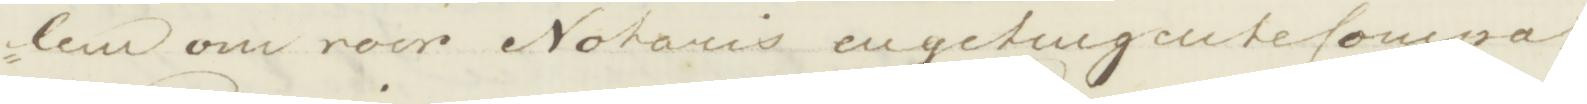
=lem om voor Notaris en getuigen te Compa.
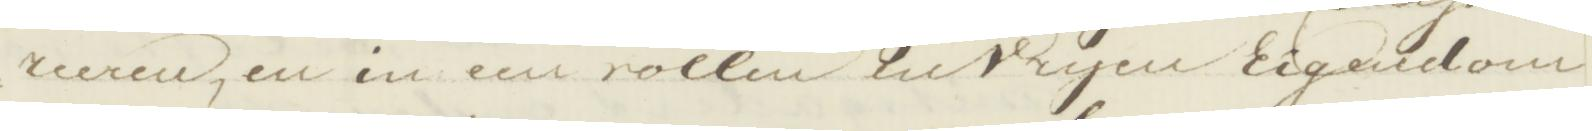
=reeren, en in een vollen in Vryen Eigendom
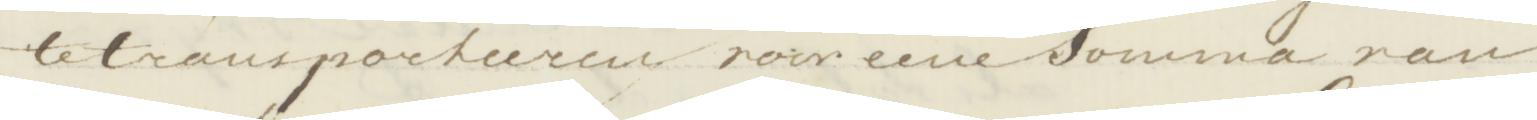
te transporteeren voor eene somma van
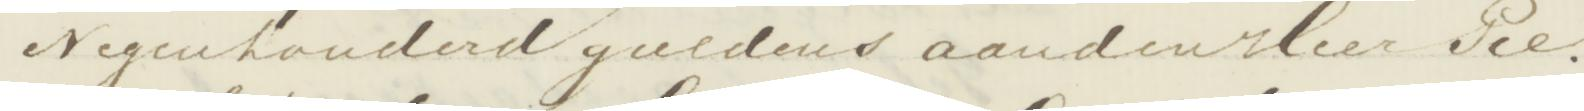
Negenhonderd guldens aan den Heer Pie.
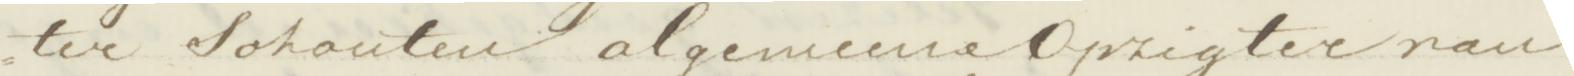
=ter Schouten algemeene Opzigter van
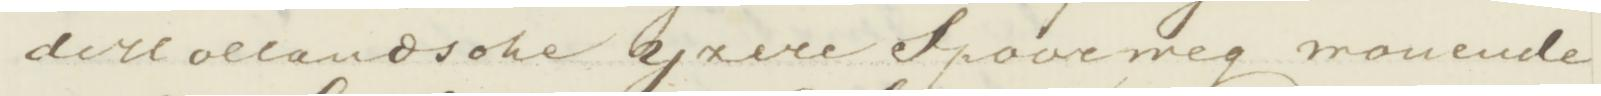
de Hollandsche yzere Spoorweg wonende
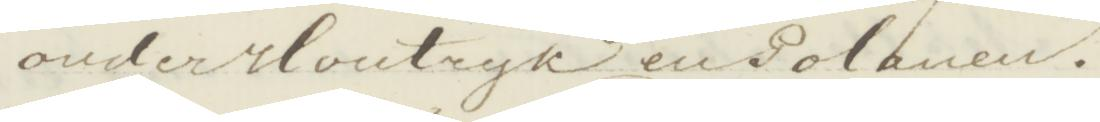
onder Houtryk en Polanen.
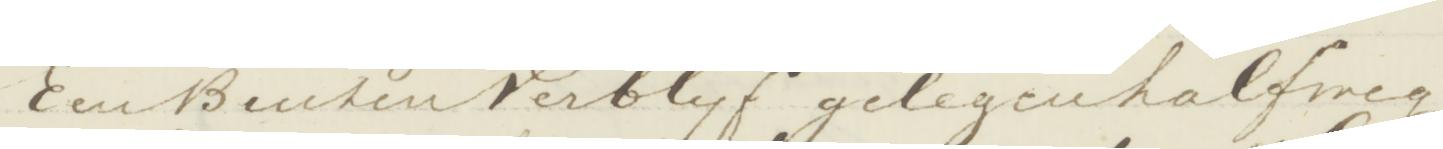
Een Buiten Verblyf gelegen halfweg
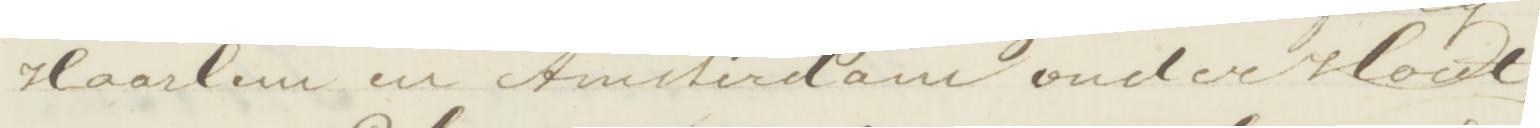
Haarlem en Amsterdam onder Hout,
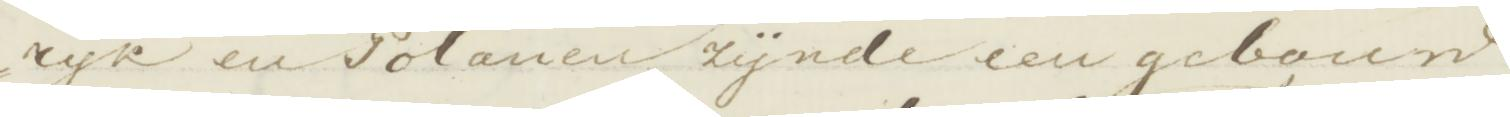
„rijk en Polanen, zijnde een gebouw
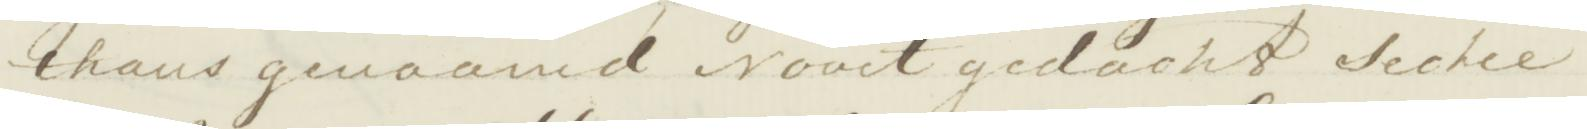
thans genaamd Nooit gedacht sectie
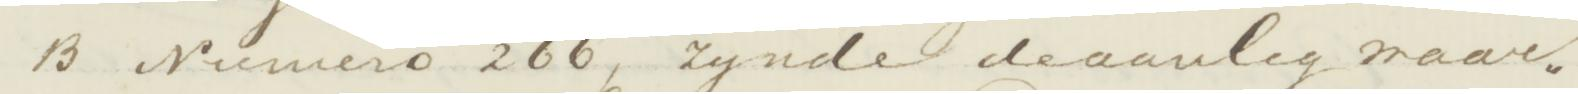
13 Numero 266, zynde de aanleg waar„
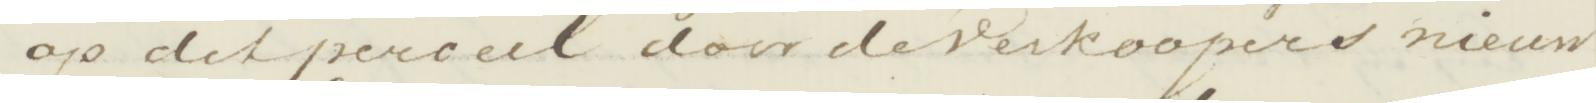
op dit perceel door de verkoopers nieuw
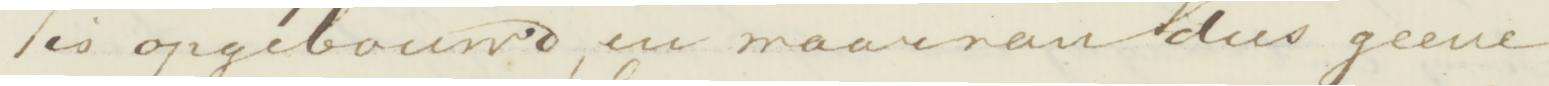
is opgebouwd, en waarvan dus geene
